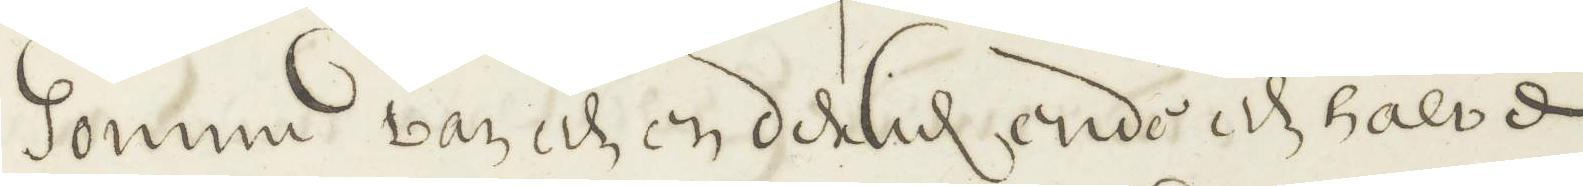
somme van een en dertich ende een halve
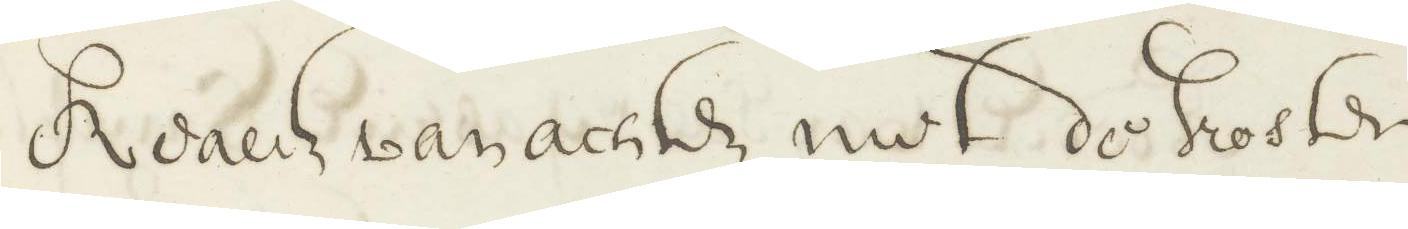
Realen van achten, met de kosten
